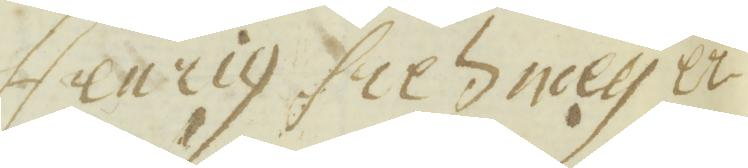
Henrig fresmeijer
